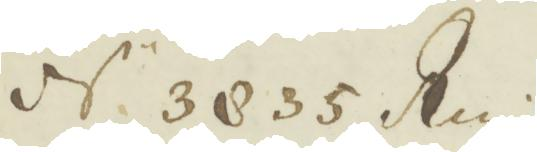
N.o 3835 Reg
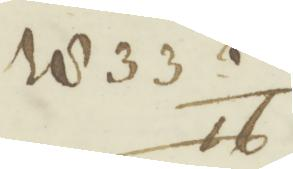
1833 4/16
